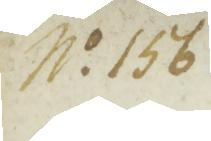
N:o 156
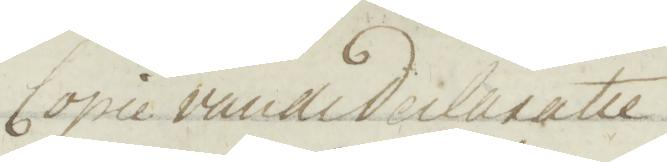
Copie van de declaratie
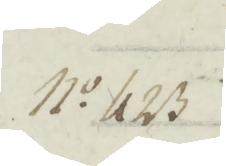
N:o 423
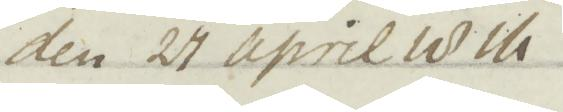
den 27 April 1814
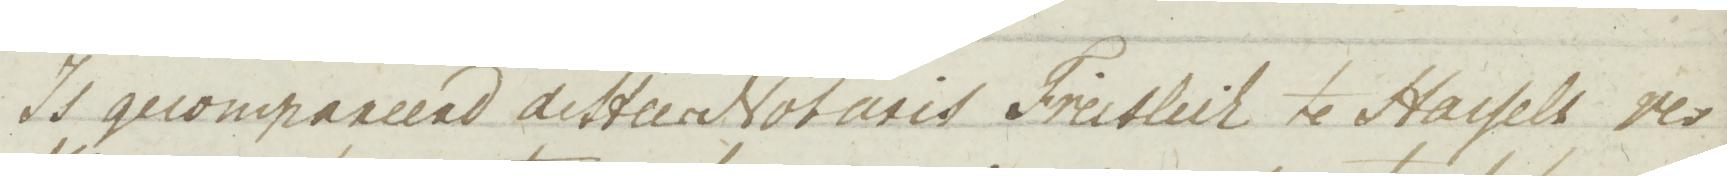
Is gecompareerd de Heer Notaris Freitlich te Hasselt ver
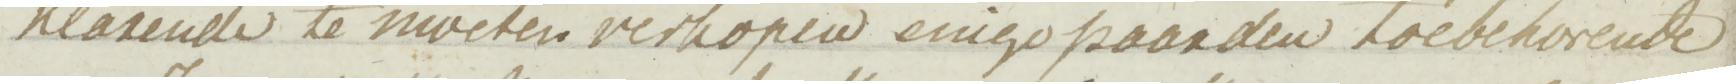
klarende te moeten verkopen enige paarden toebehorende
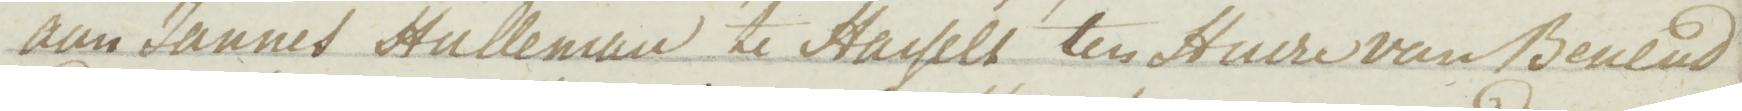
aan Iannes Hulleman te Hasselt ten Huize van Berend
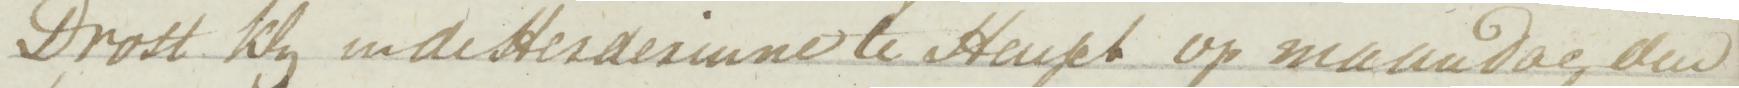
Drost klz in de Herderinne te Heupt op maandag den
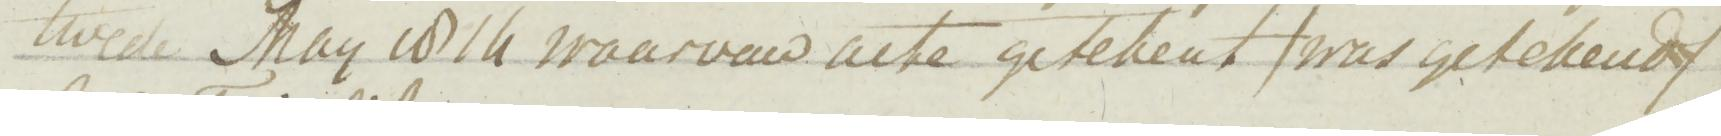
twede May 1814 waarvan acte getekent / was getekend/
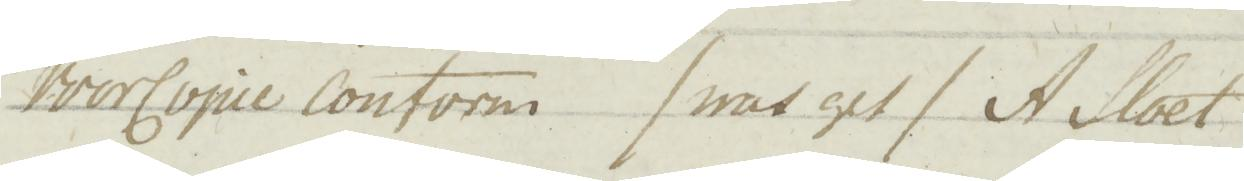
Voor Copie Conform /was get / A Sloet
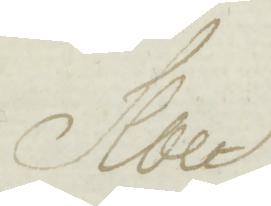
Sloet
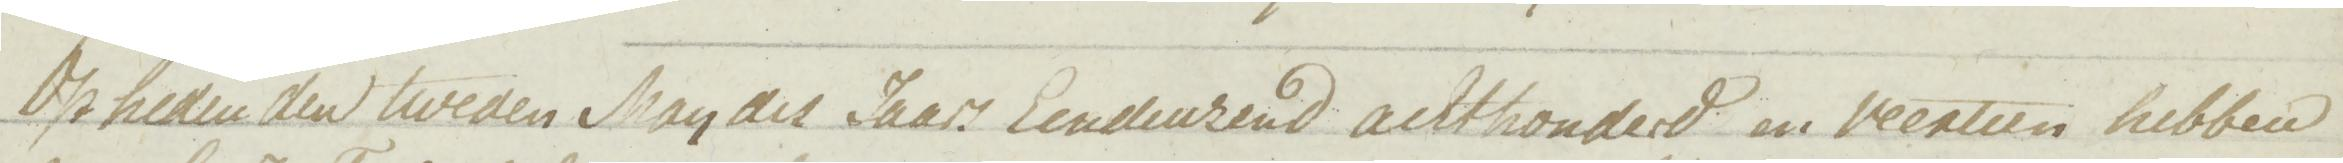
Op heden den tweden May des Jaars Een duizend achthonderd en veertien hebben
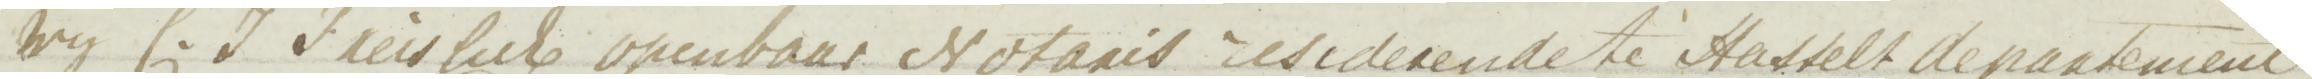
wy C: I Freitlich openbaar Notaris residerende te Hasselt departement
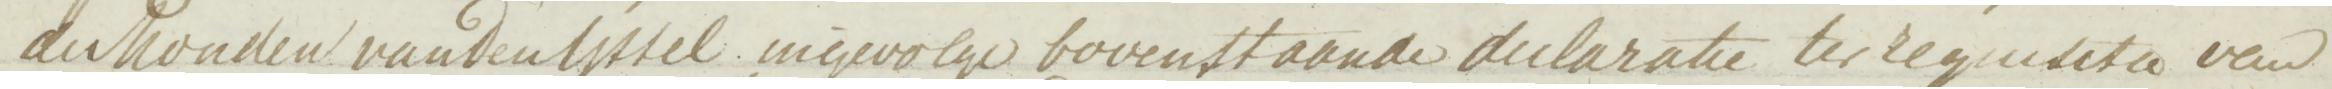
der Monden van den Yssel ingevolge bovenstaande declaratie ter requisitie van
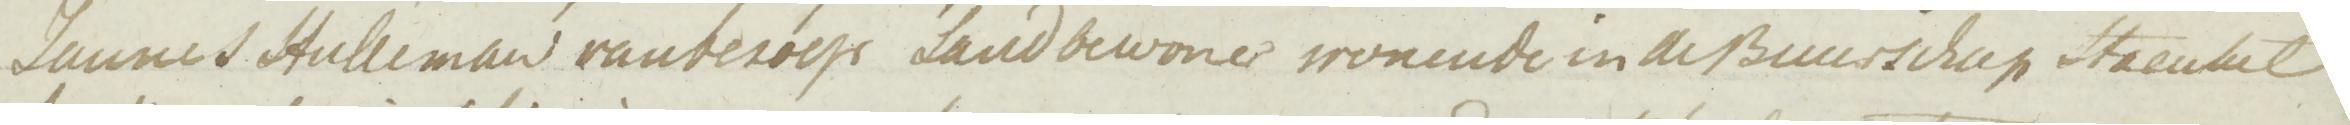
Iannes Hulleman van beroep Landbewoner wonende in de Buurschap Streukel
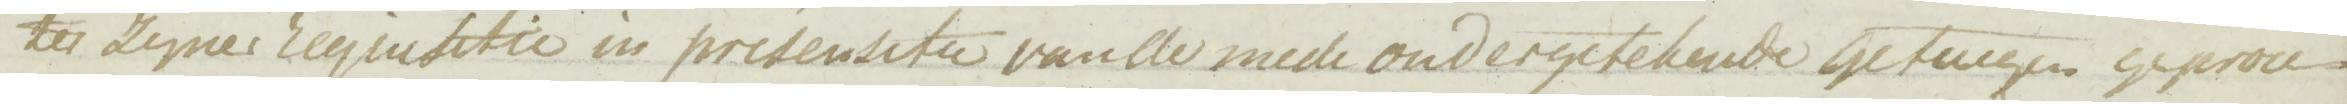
ter zyner requisitie in presensitie van de mede ondergetekende getuigen geproce
